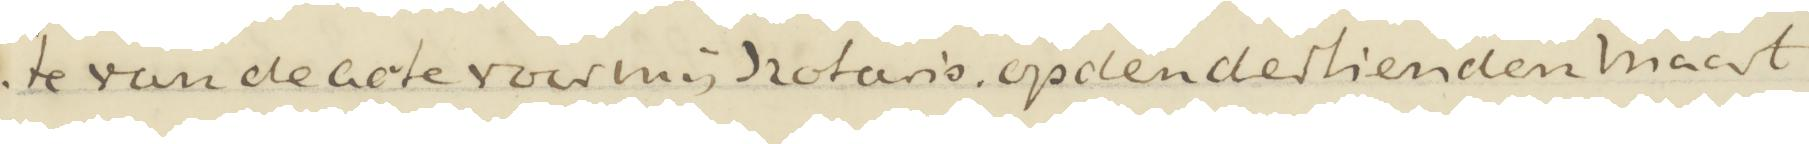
te van de acte voor mij Notaris, op den dertienden maart
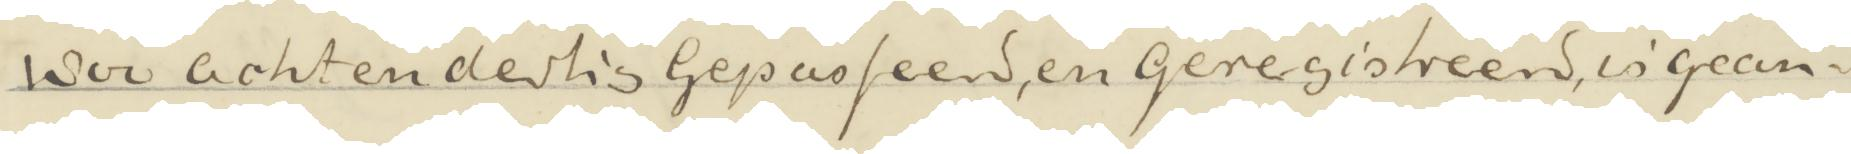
1800 achten dertig Gepasseerd, en Geregistreerd, is gean=
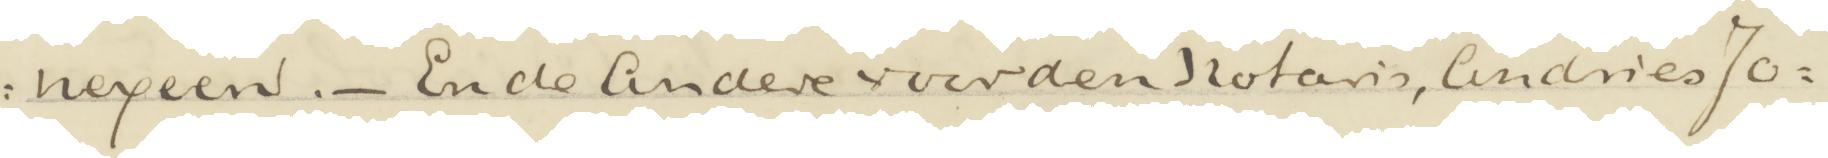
„nexeerd. - En de Andere voor den Notaris, Andries Jo=
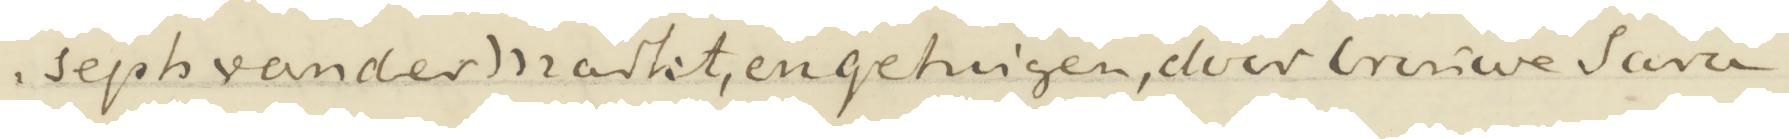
„seph van der Markt, en getuigen, door vrouwe Sara
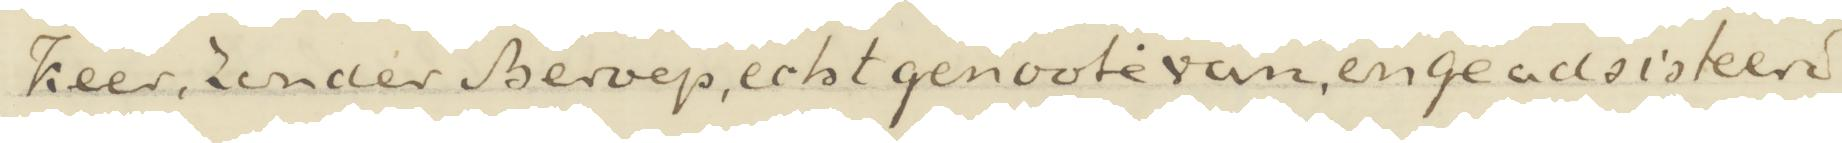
Keer, Zonder Beroep, echtgenoote van, en geadsisteerd
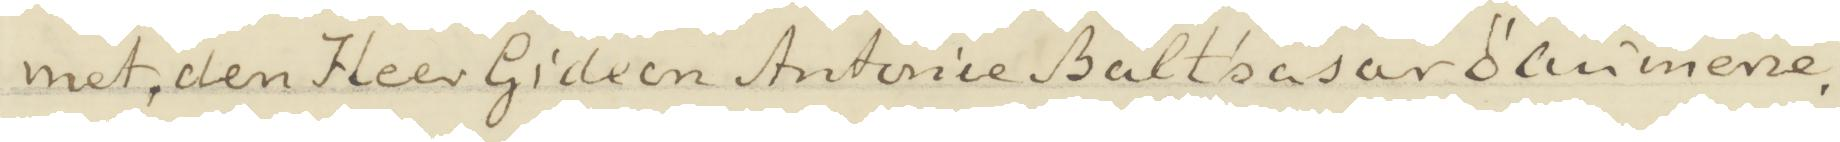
met, den Heer Gideon Antonie Balthasar d'Aumerie
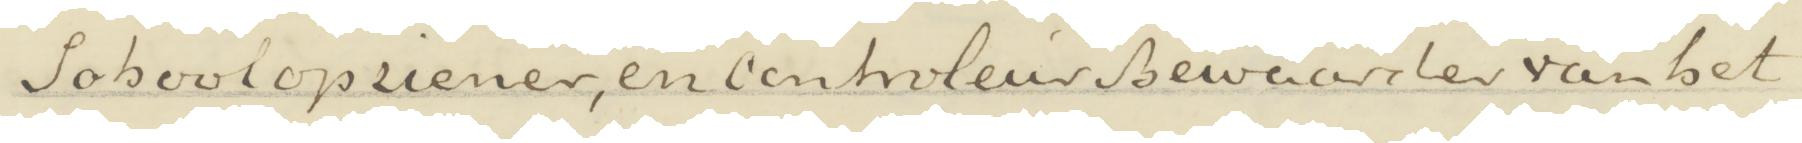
Schoolopziener, en controleur Bewaarder van het
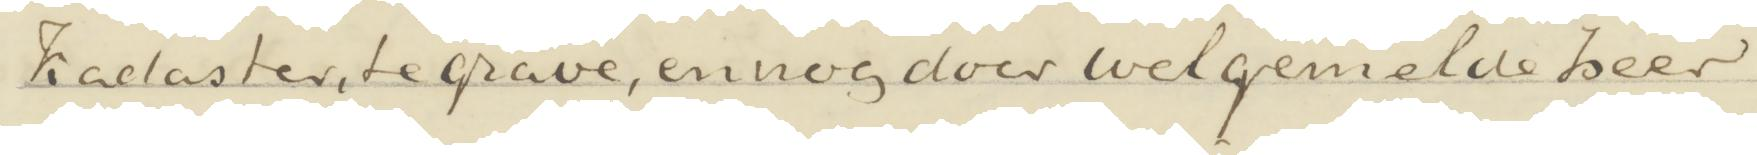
Kadaster, te grave, en nog door welgemelde heer
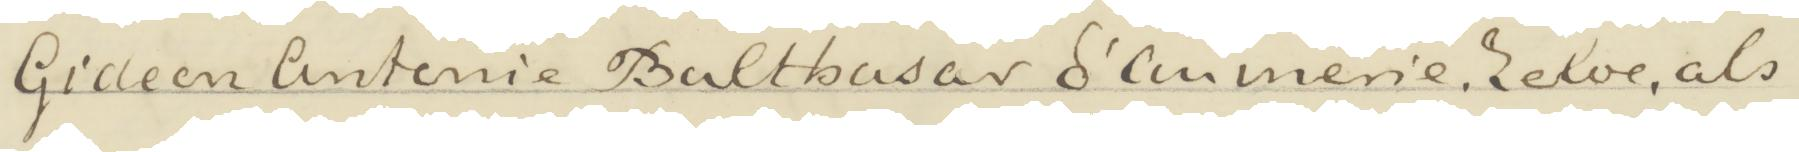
Gideon Antonie Balthasar d'Aumerie, Zelve, als
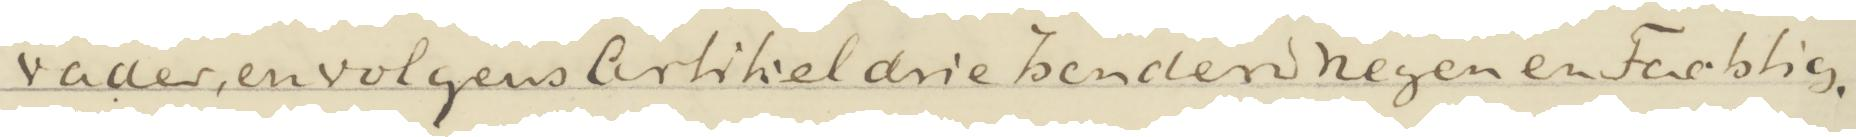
vader, en volgens Artikel drie honderd negen en Tachtig
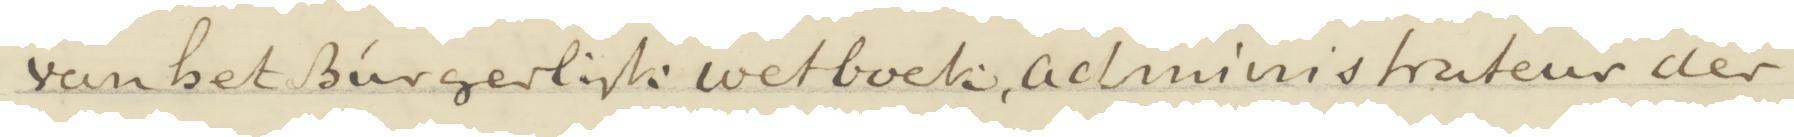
van het Burgerlijk wetboek, administrateur der
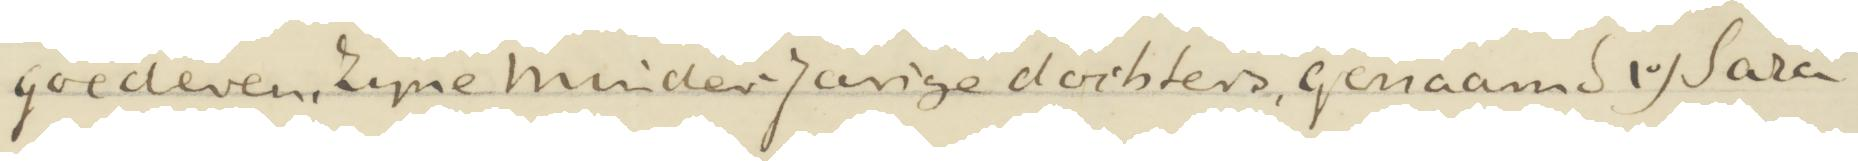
goederen Zyne minder Jarige dochters, genaamd 1') Sara
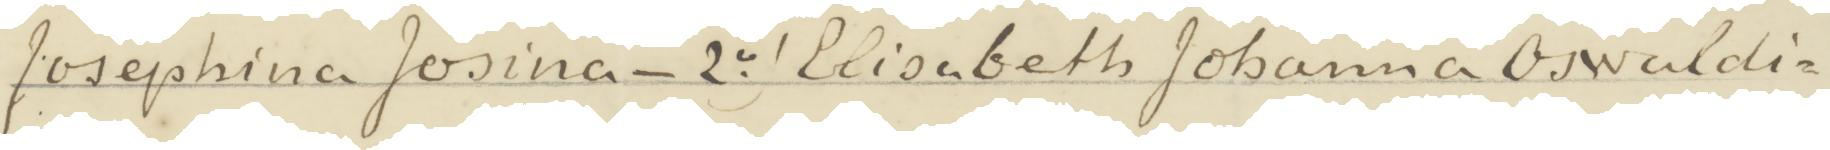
Josephina Josina - 2.') Elisabeth Johanna Oswaldi=
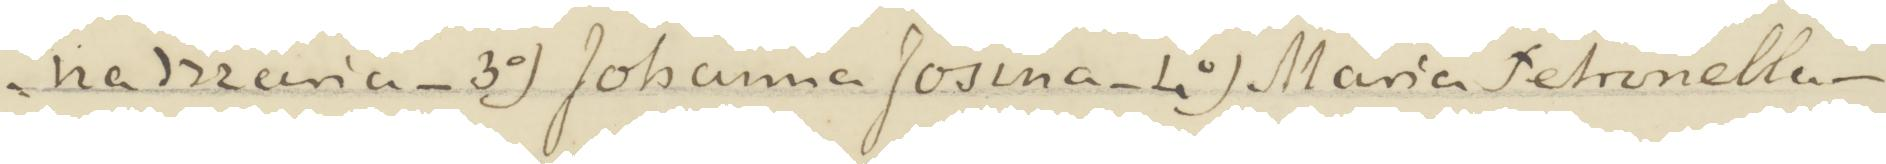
=na Maria - 3') Johanna Josina - 4') Maria Petronella -
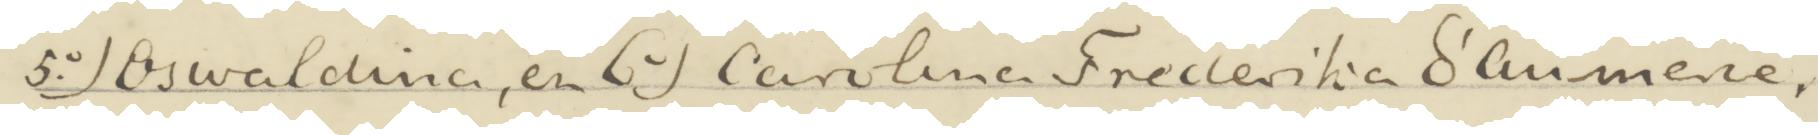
5') Oswaldina, en 6') Carolina Frederika d'Aumerie,
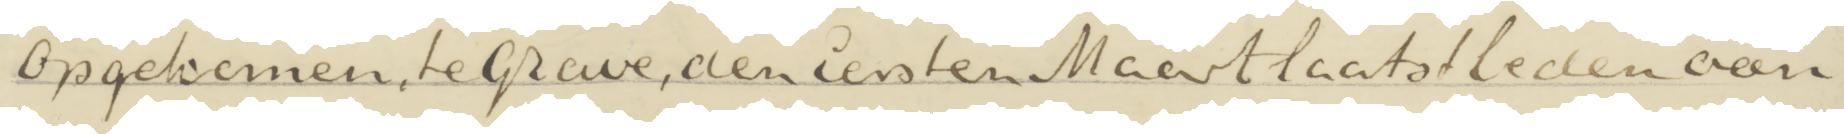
Opgekomen te Grave, den Eersten Maart laatstleden aan
